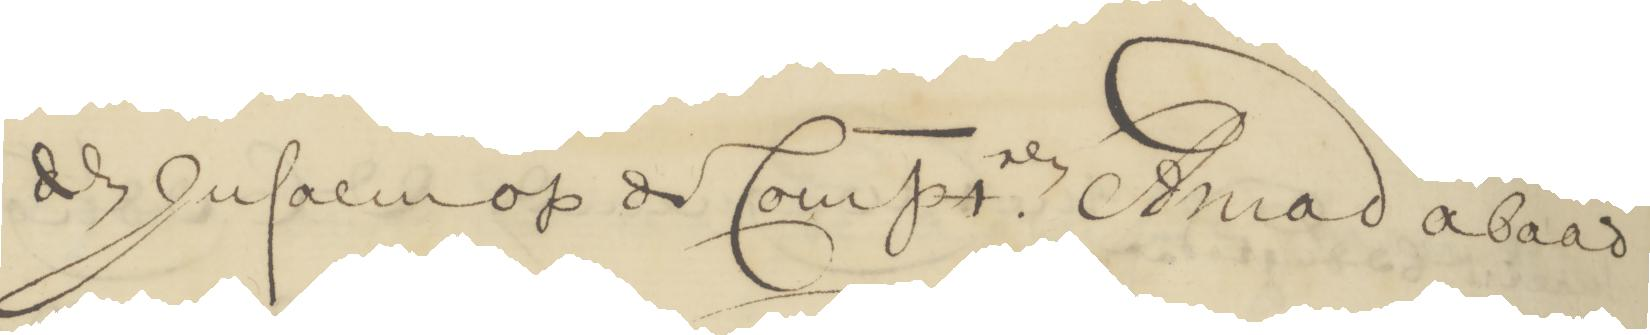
den Insaem op de Compt:ren Amad abaad
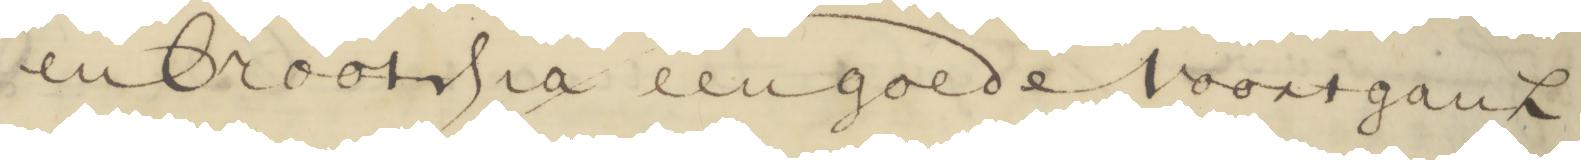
en brootchia een goede voortgank
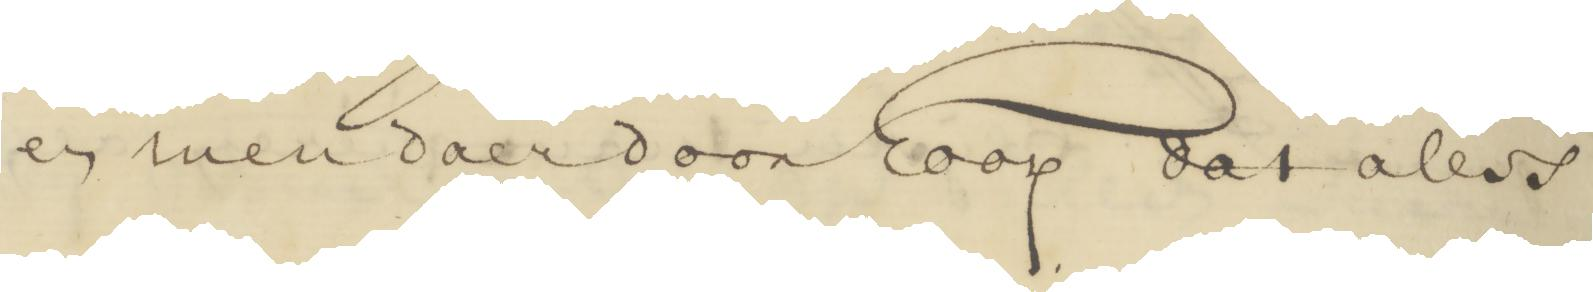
en men daer door hoop dat alless
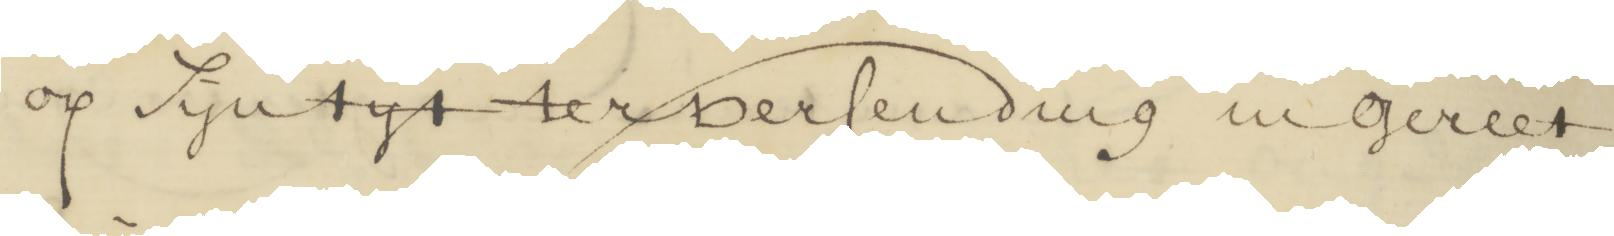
op sijn tijt ter versending in gereet
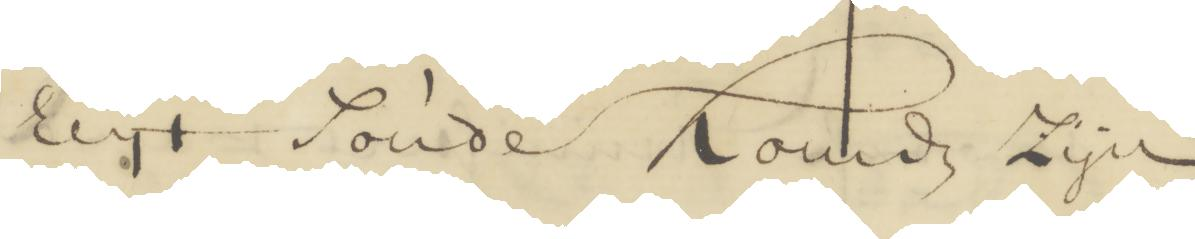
heijt soude komen zijn
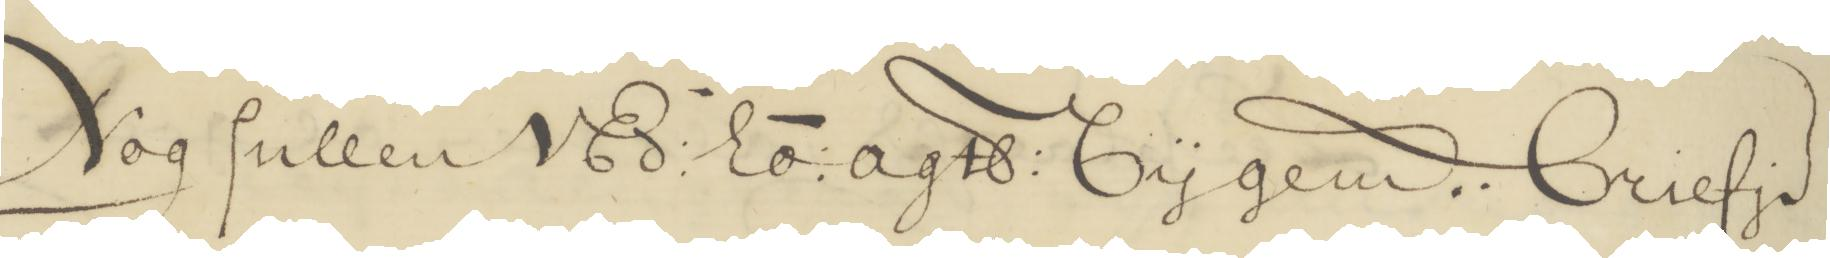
Nog sullen UEd: ho: agtb: Bij gem: Briefje
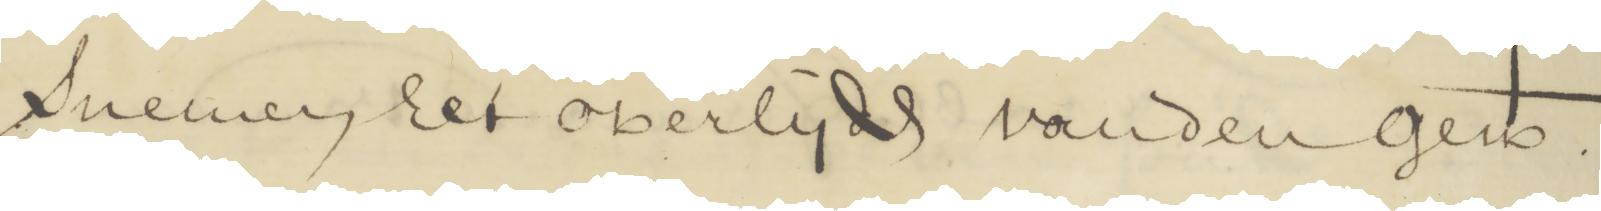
vernemen het overlijden van den gew.
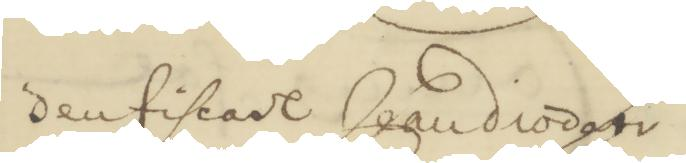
den fiscael Jean diodati
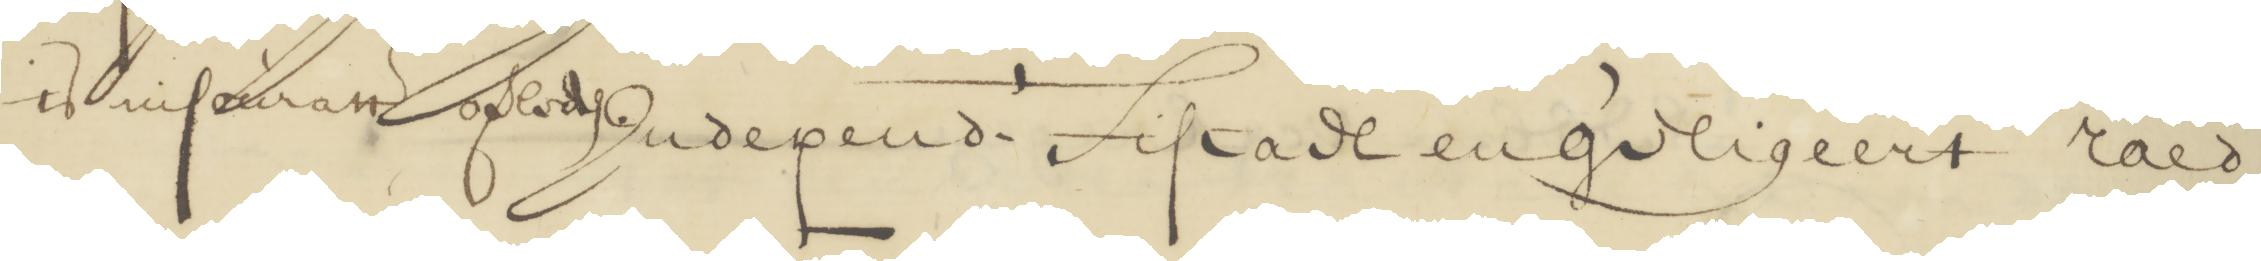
is in souratt overleden Independ.t Fiscael en g'eligeert raed
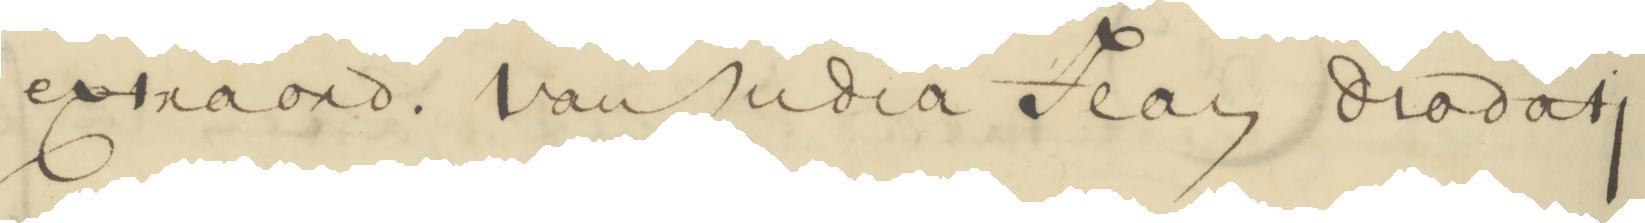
extraord:s van India Jean diodatj
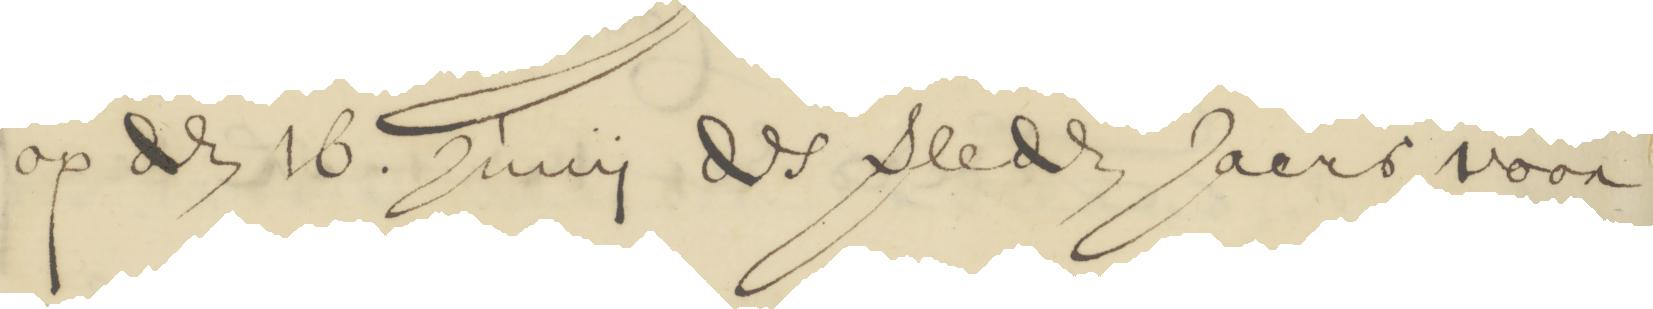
op den 16. Junij des verleden Jaers voor
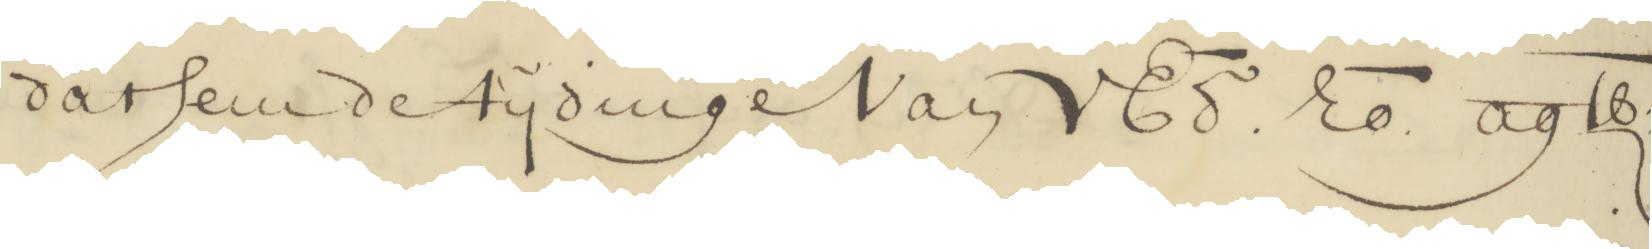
dat hem de tijdinge van UEd. ho. agtb:
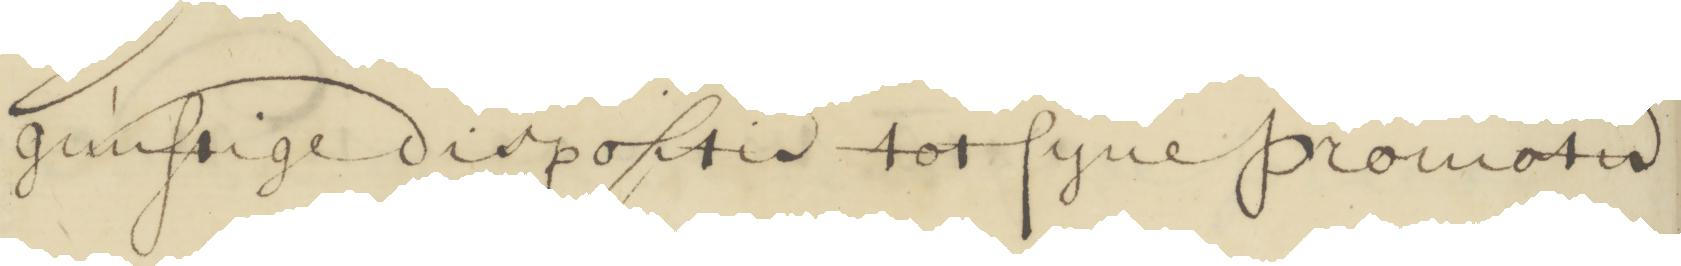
gunstige dispositie tot sijne promotie
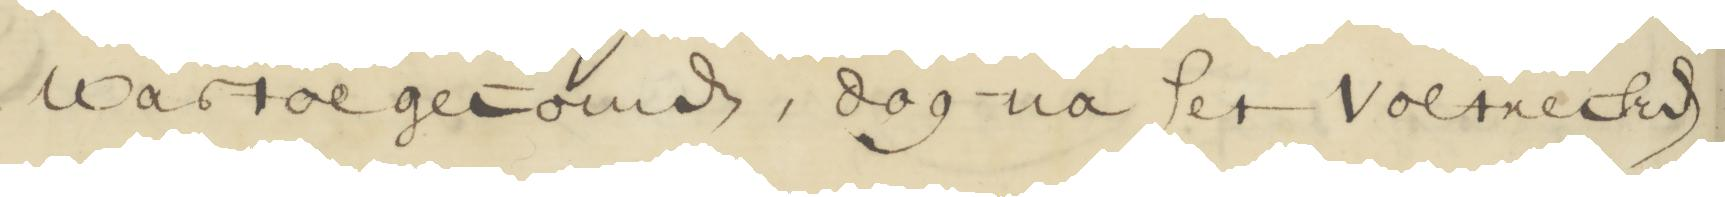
was toe gecomen, dog na het voltrecken
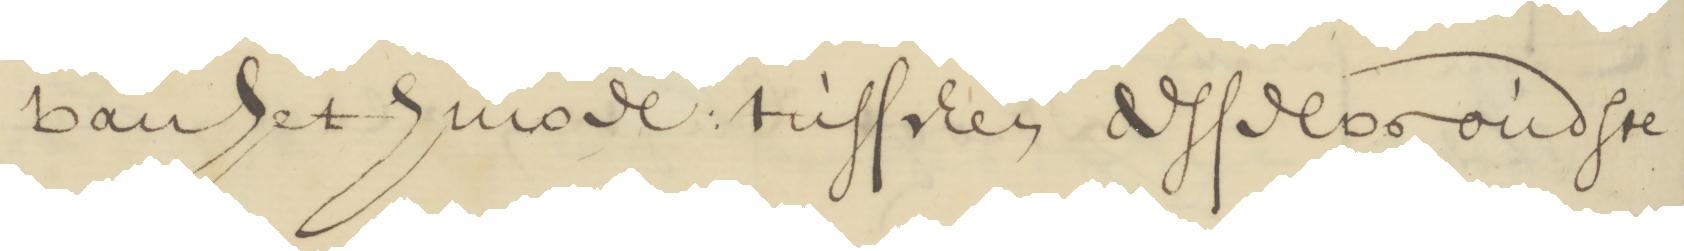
van het huwel: tusschen desselvs oudste
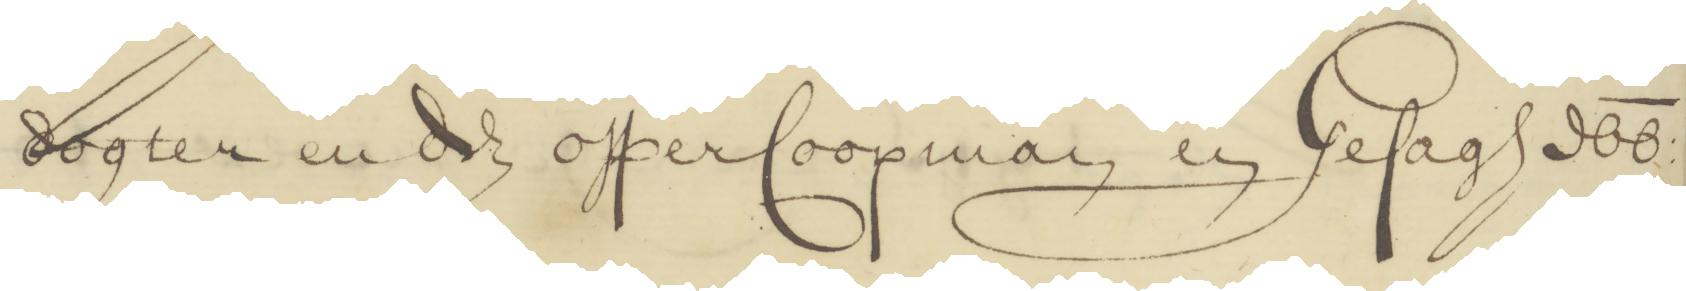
dogter en den opperCoopman en Gesaghebb:
